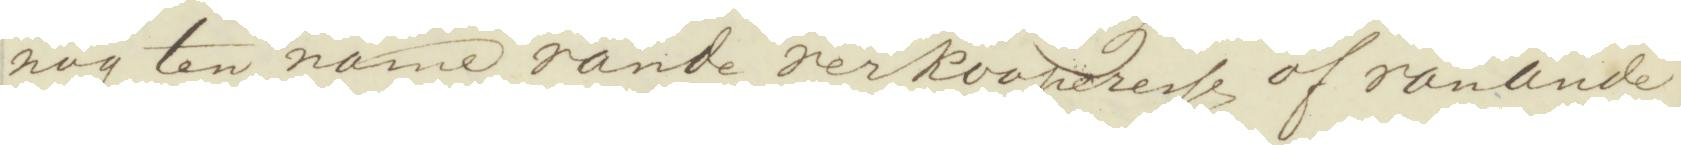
nog ten name vande verkooperesse of van ande
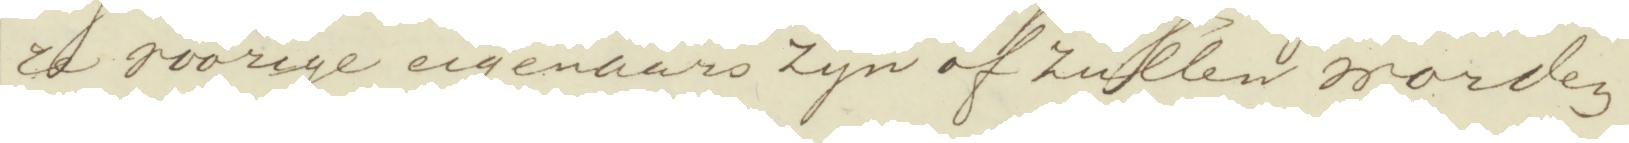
re voorige eigenaars zijn of zullen worden
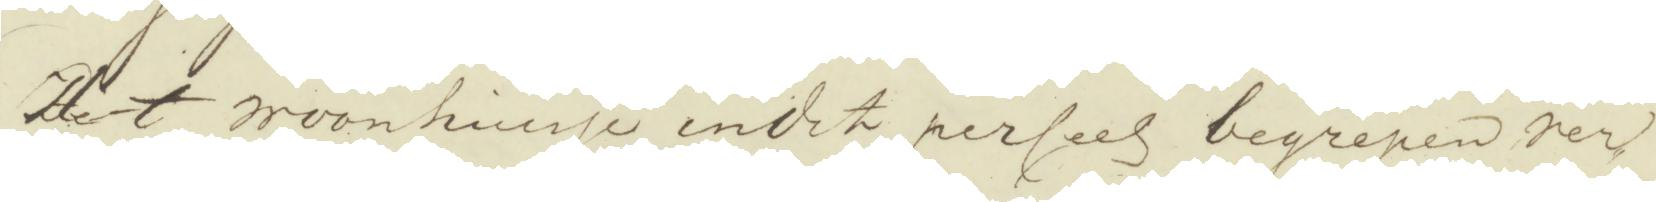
Het woonhuisje in dit perceel begreven ver„
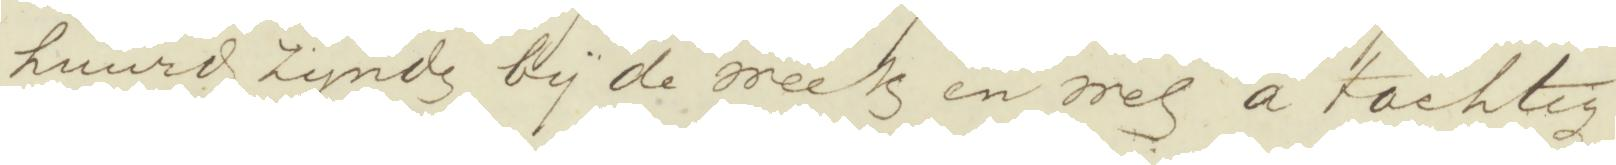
huurd zijnde bij de week en wel a tachtig
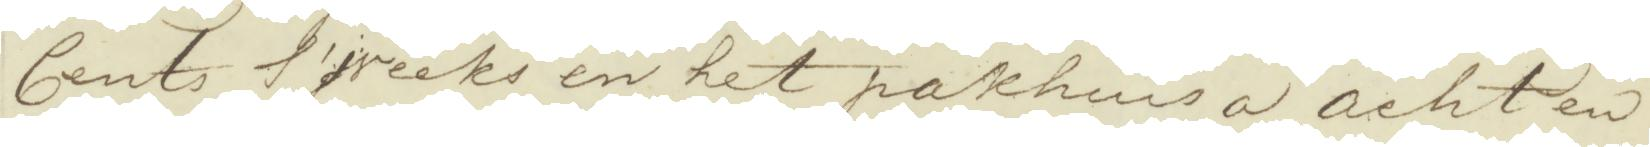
Cents s'weeks en het pakhuis a acht en
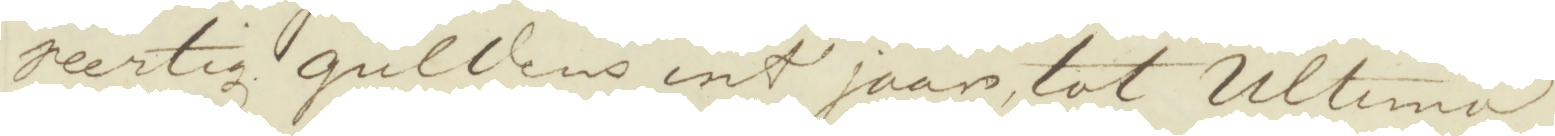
veertig guldens int jaar, tot Ultima
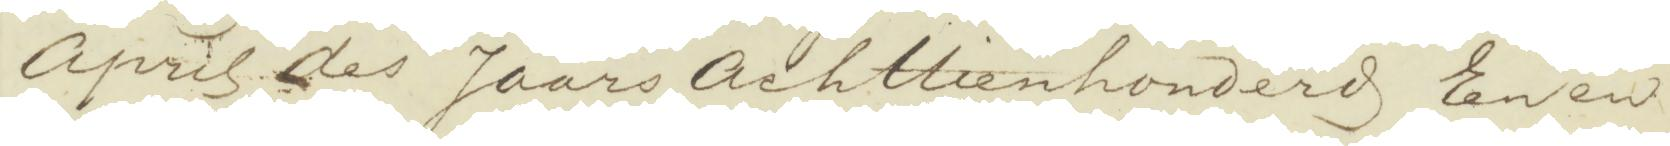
April des Jaars Achttienhonderd Een en
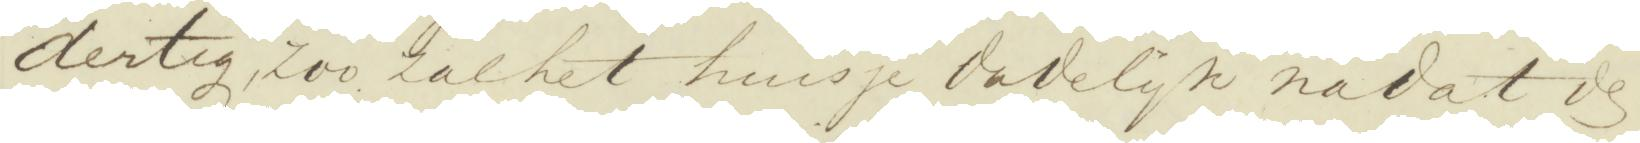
dertig, zoo zal het huisje dadelijk nadat de
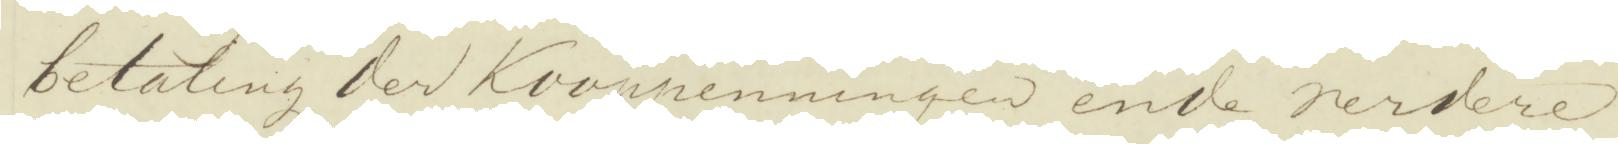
betaling der Kooppenningen ende verdere
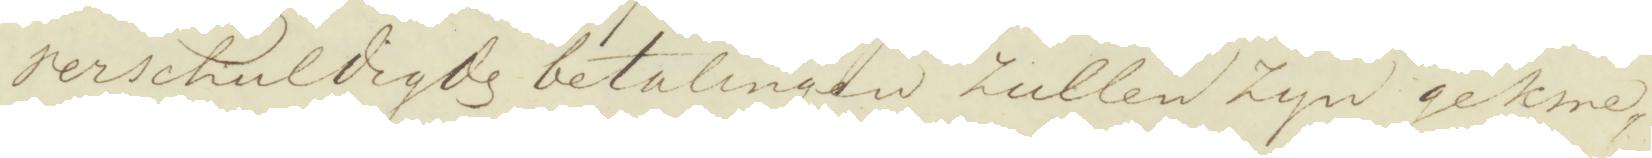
verschuldigde betalingen zullen zyn gekwe„
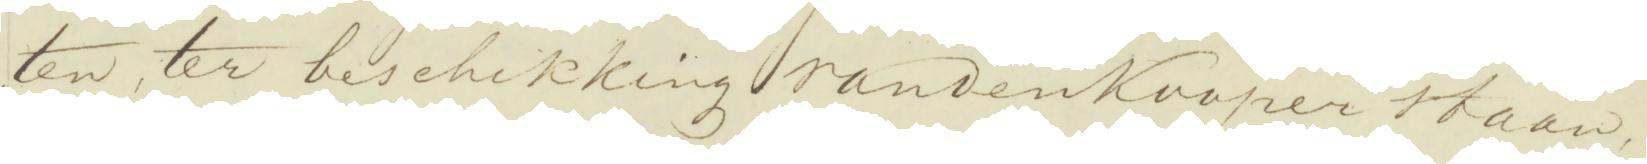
„ten, ter beschikking van den Kooper staan,
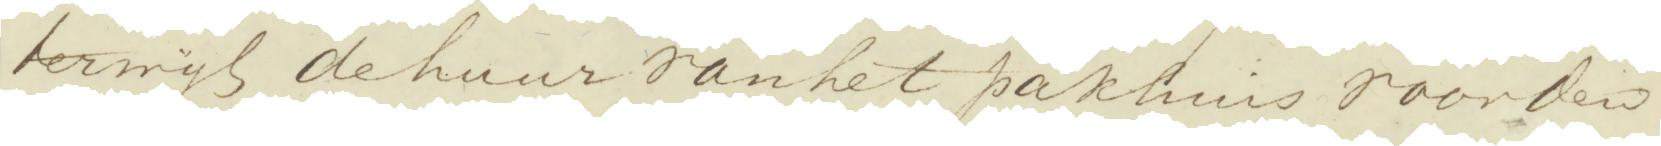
terwijl de huur van het pakhuis voor den
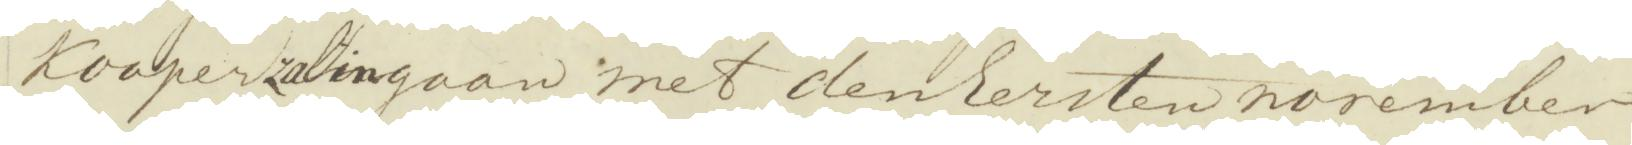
Kooper zal ingaan met den Eersten november
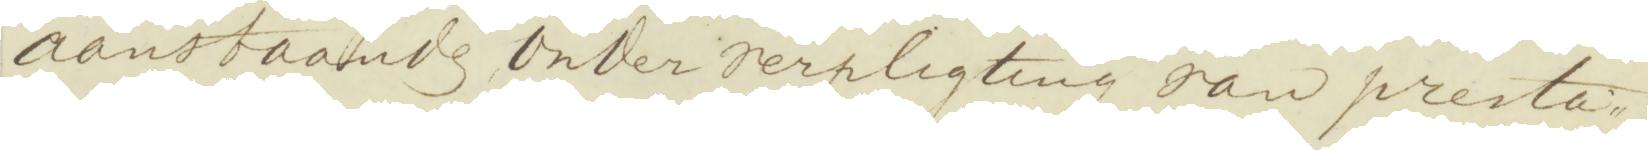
aanstaande, onder verpligting van presta„
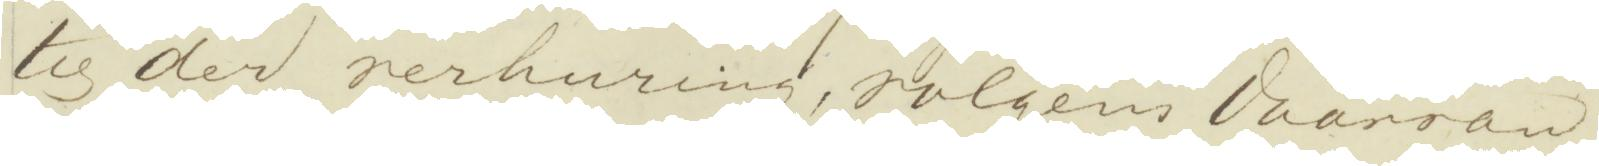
tie der verhuring, volgens daarvan
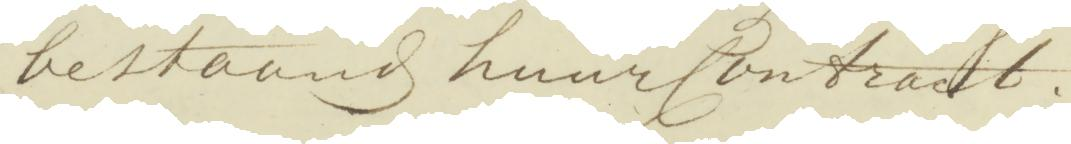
bestaand huur Contract.
